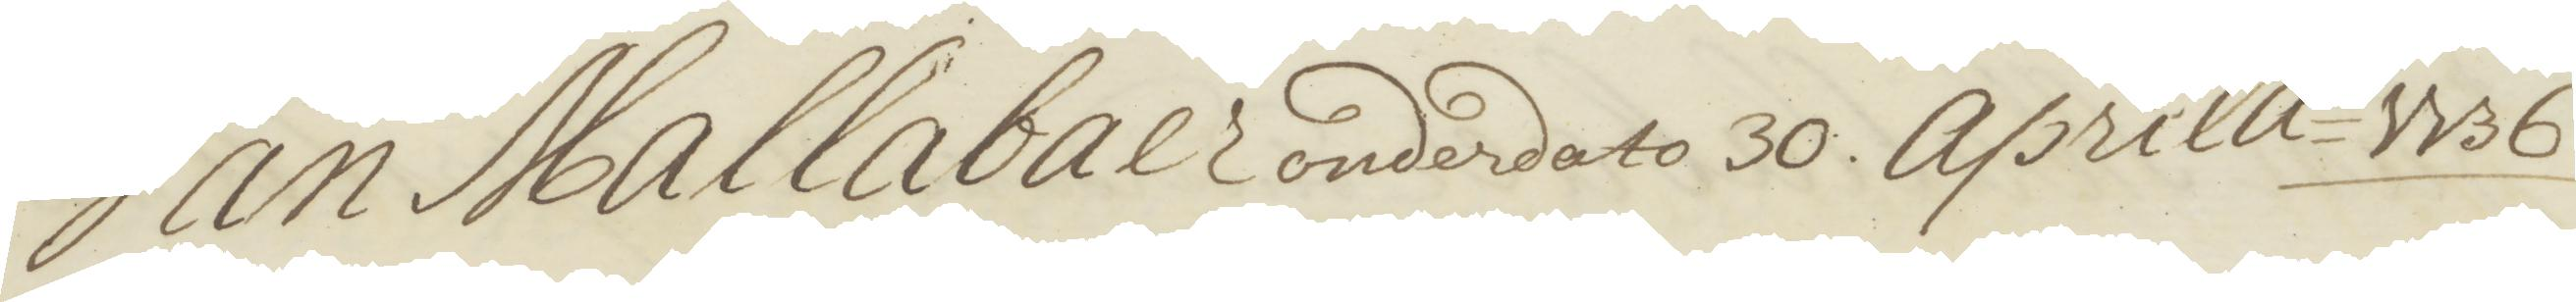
Van Mallabaer onderdato 30. April A=o 1736
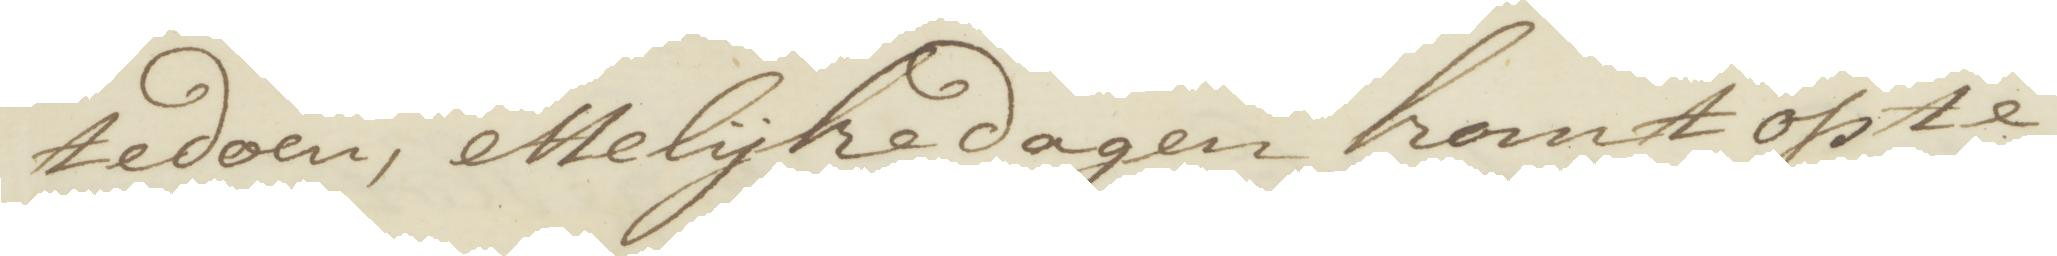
tedoen, ettelijke dagen komt op te
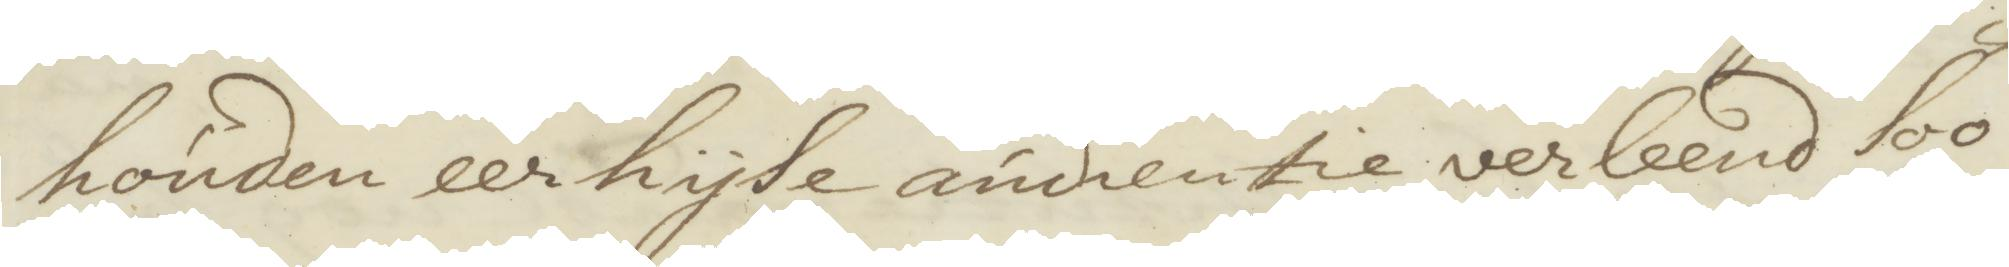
houden eer hijse audientie verleend soo
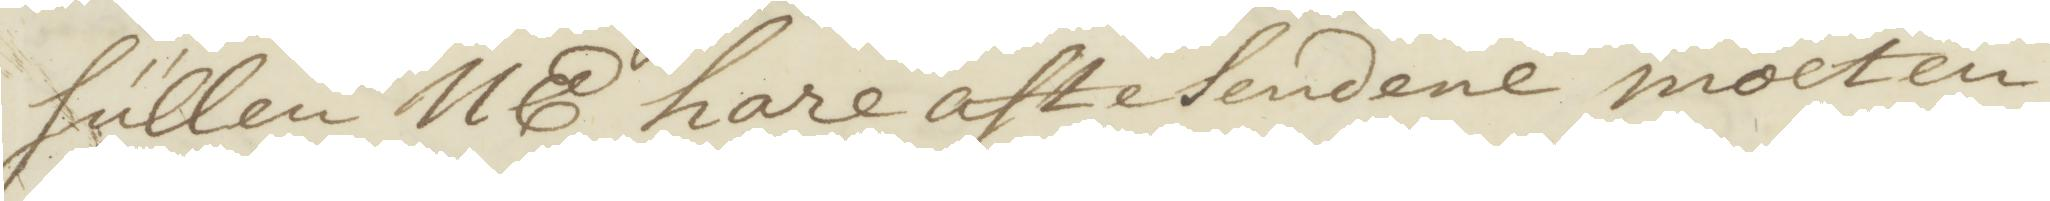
sullen UE hare afte sendene moeten
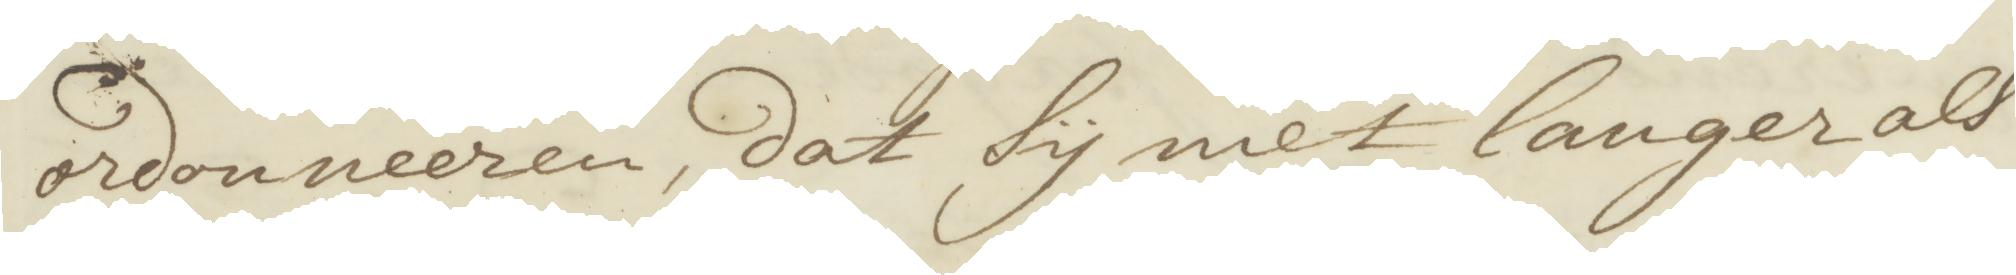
ordonneeren, dat sij niet langer als
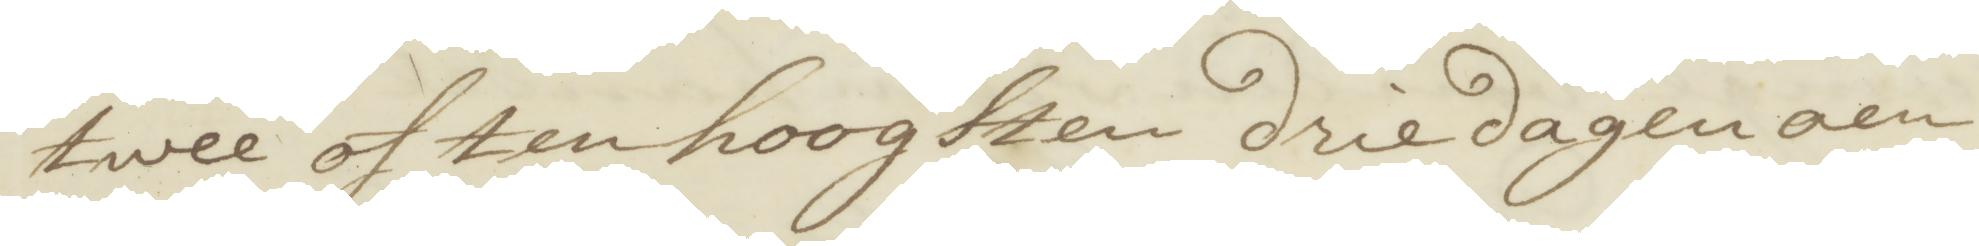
twee of ten hoogsten drie dagen aen
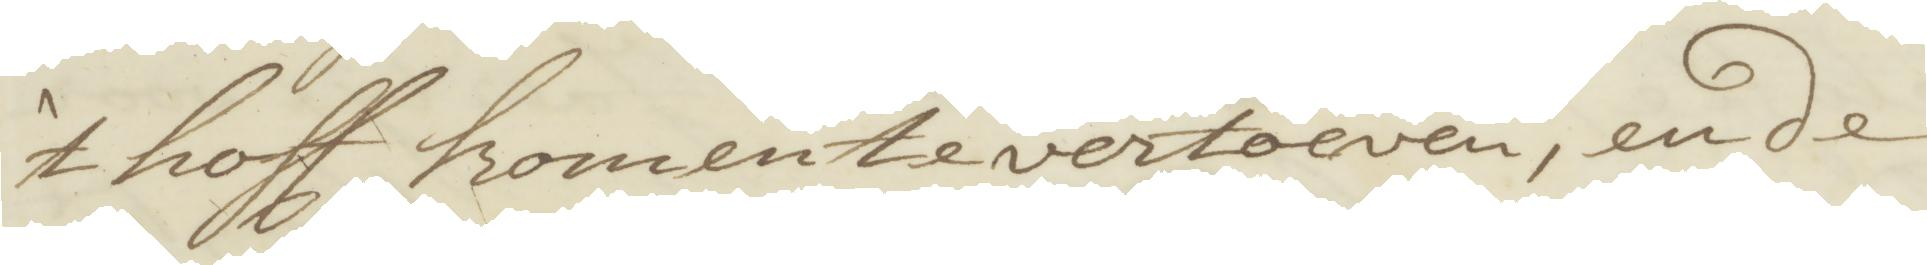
’t hoff komen te vertoeven, en de
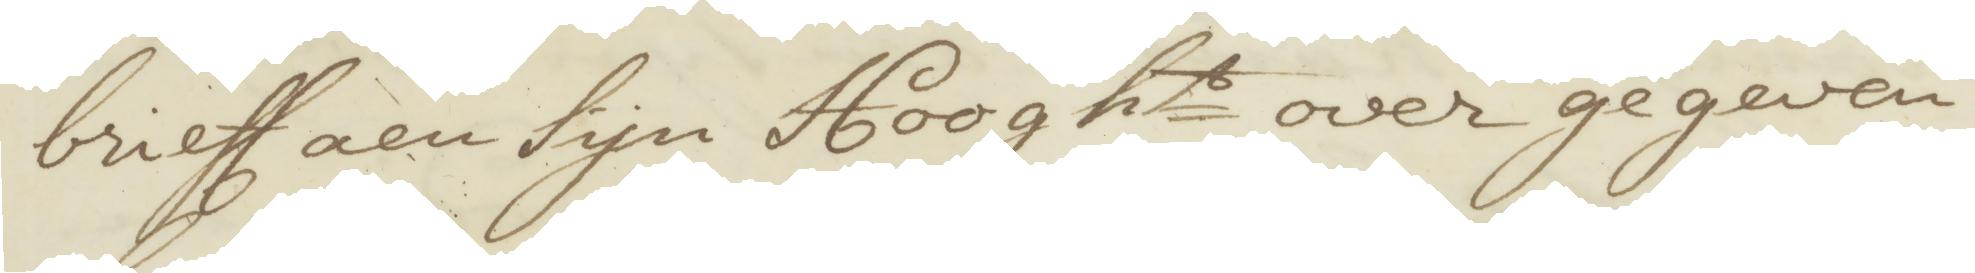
brieff aen sijn Hoogh=t over gegeven
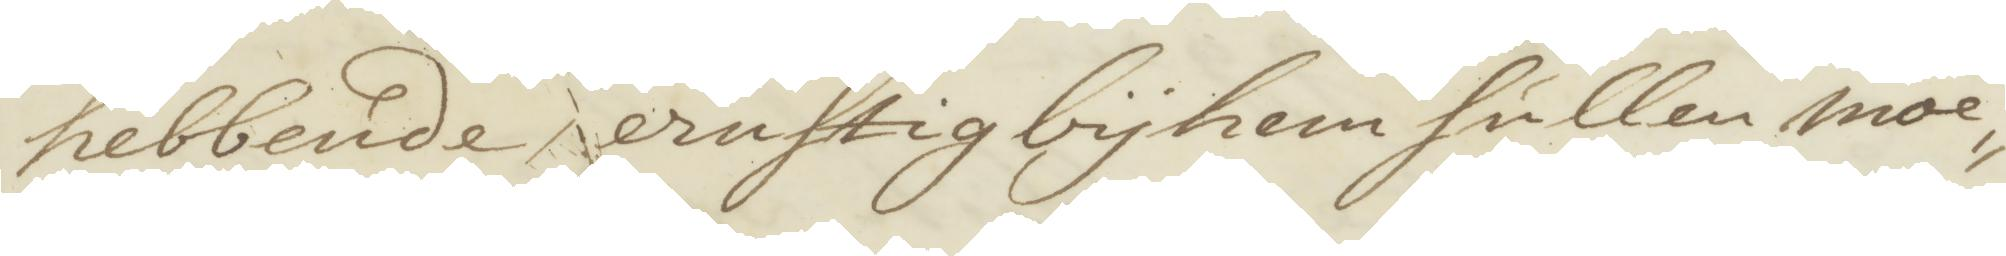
hebbende ernstig bij hem sullen moe„
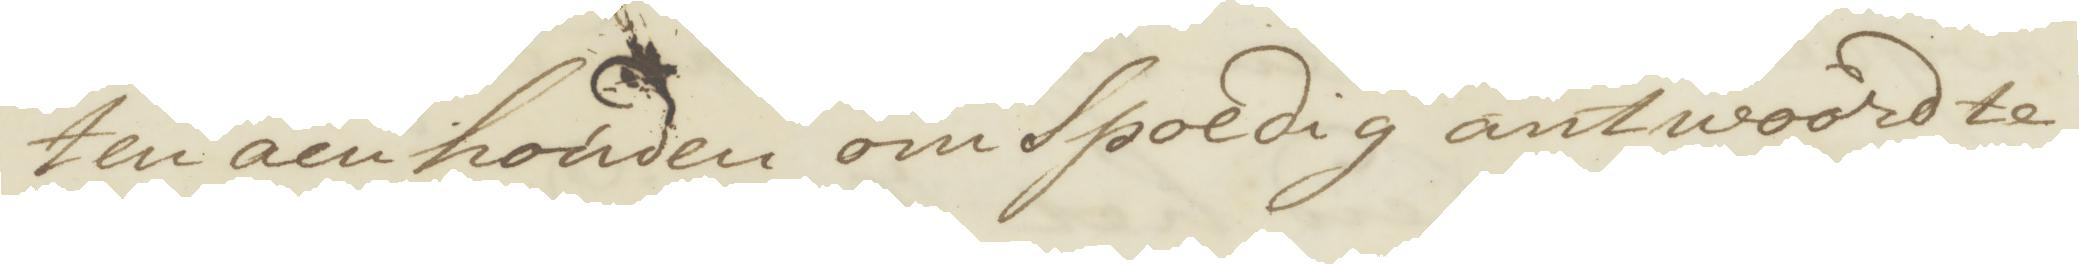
ten aen houden om spoedig antwoord te
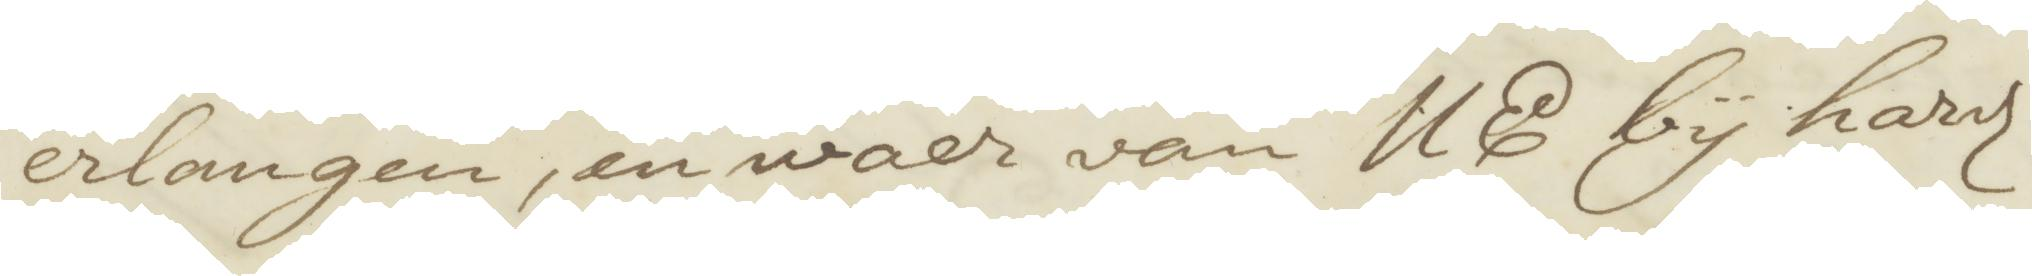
erlangen, en waer van UE bij haren
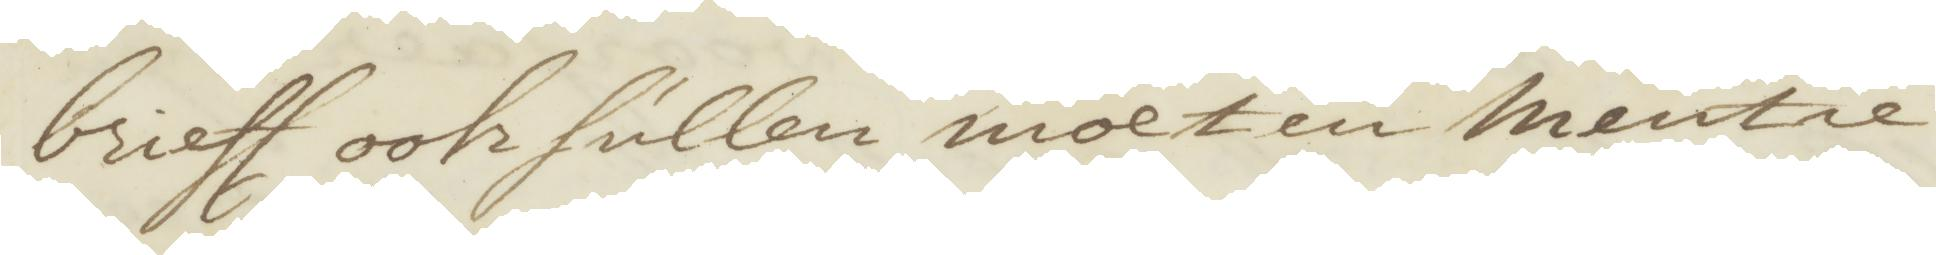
brieff ook sullen moeten mentie
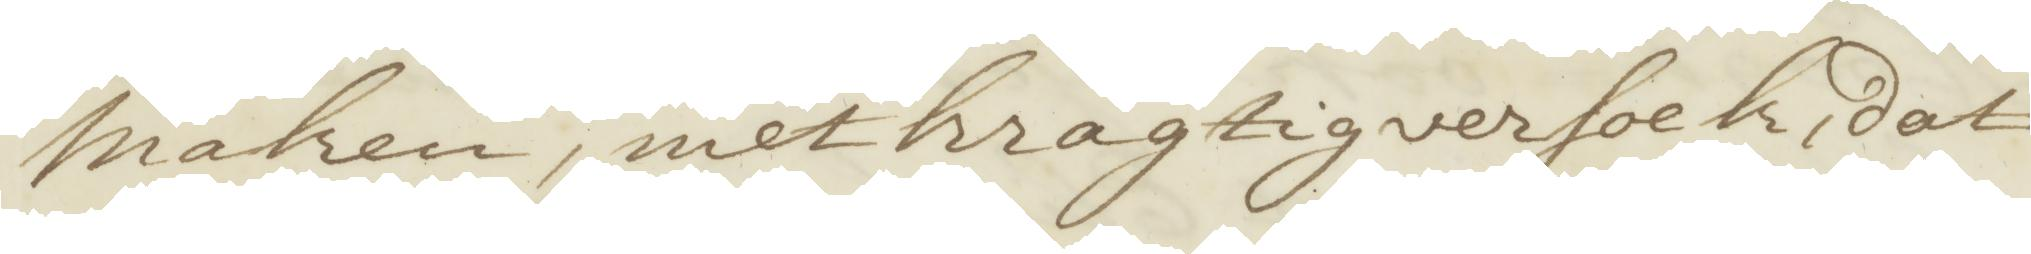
maken, met kragtig versoek, dat
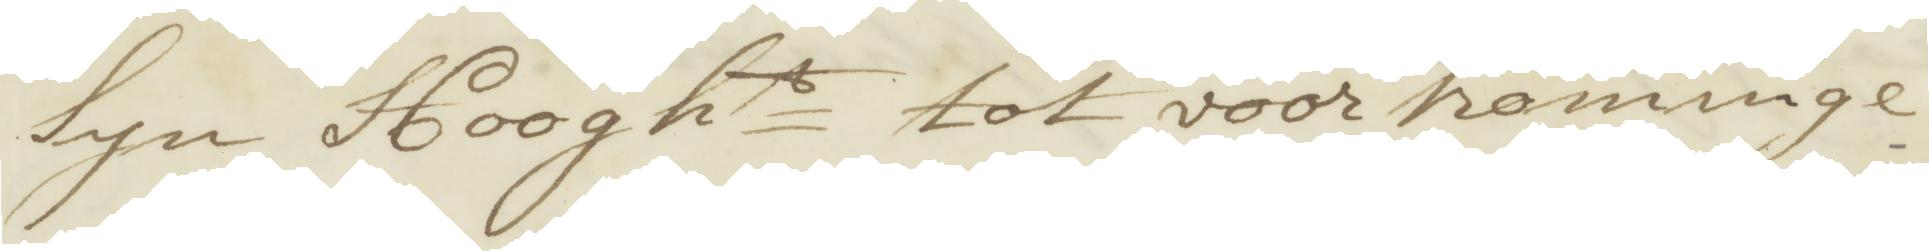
syn Hoogh=t tot voorkominge
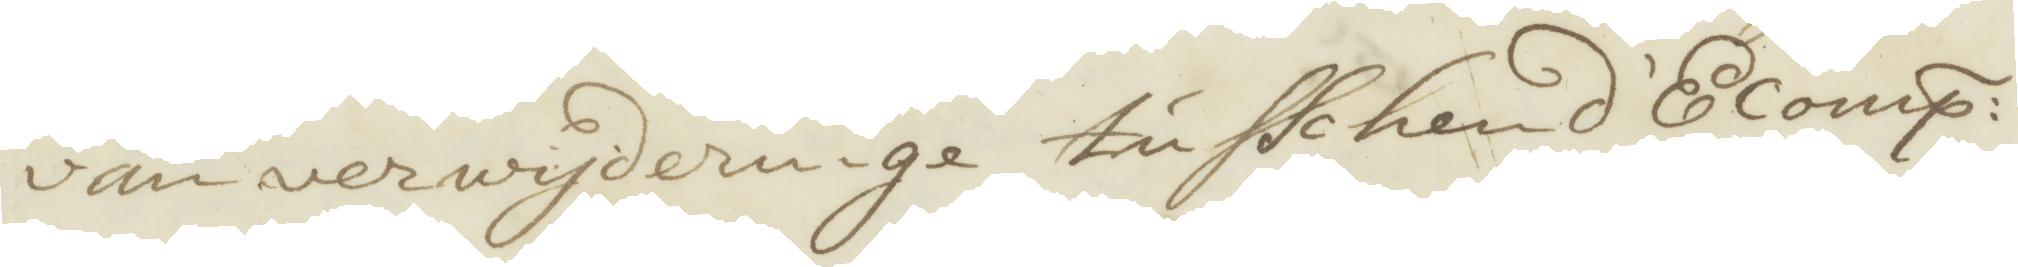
van verwijderinge tusschen d’ Ecomp:
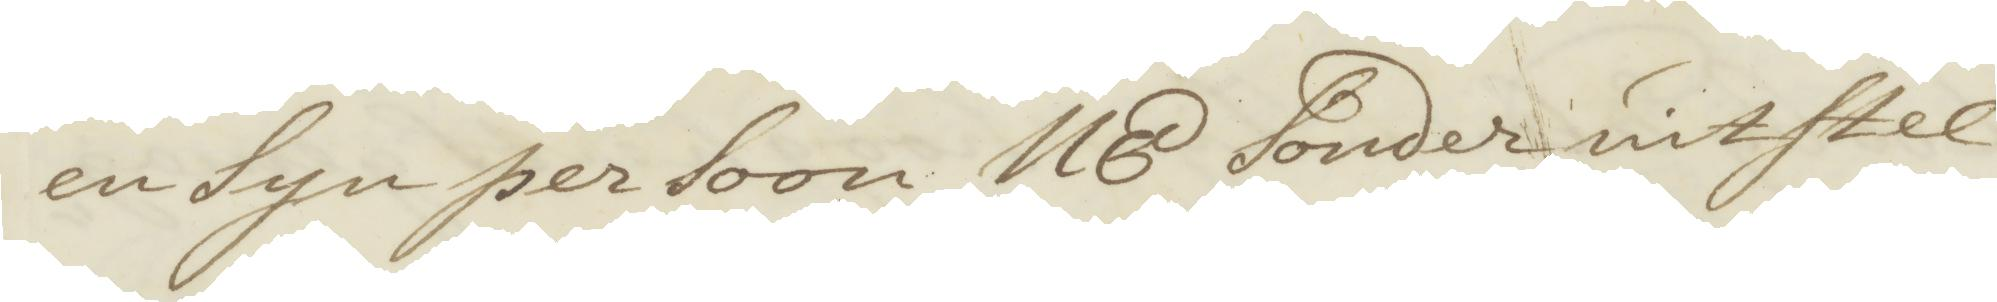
en syn per soon UE sonder uitstel
